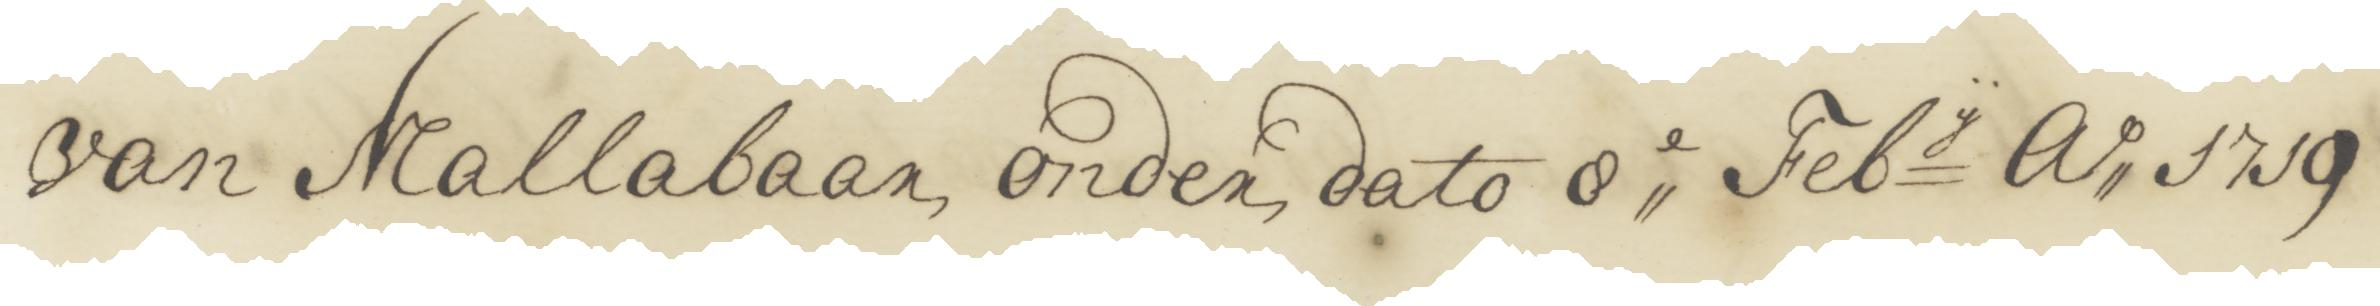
van Mallabaar onder dato 8„e Feb=ij A„o 1719
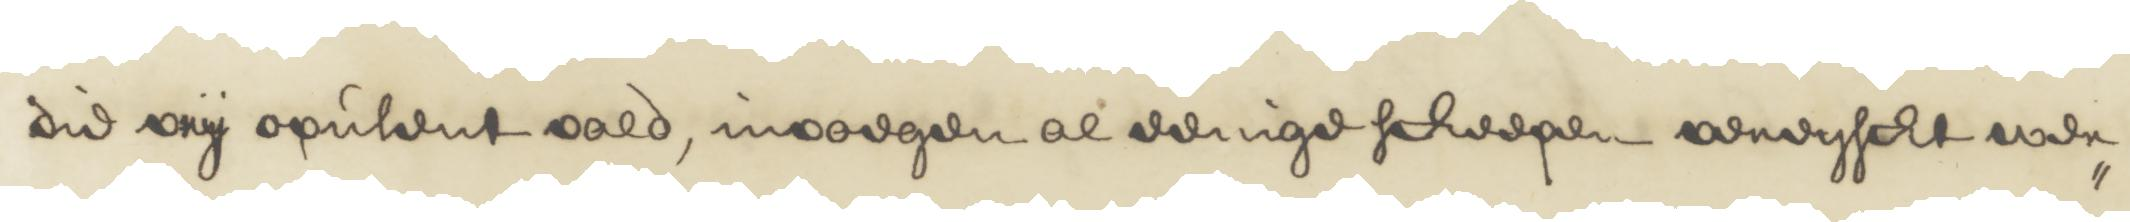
die vrij opulent vald, invoegen al eenige scheepen vereijscht wer„
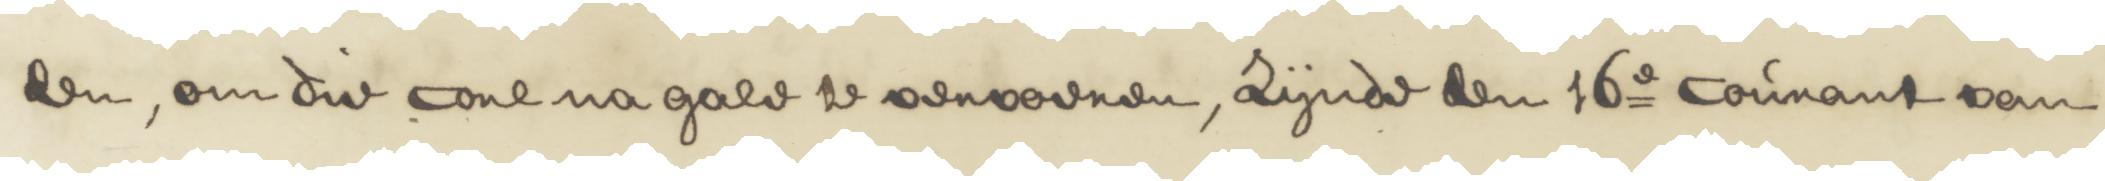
den, om die corl na gale te vervoeren, zijnde den 16=e Courant van
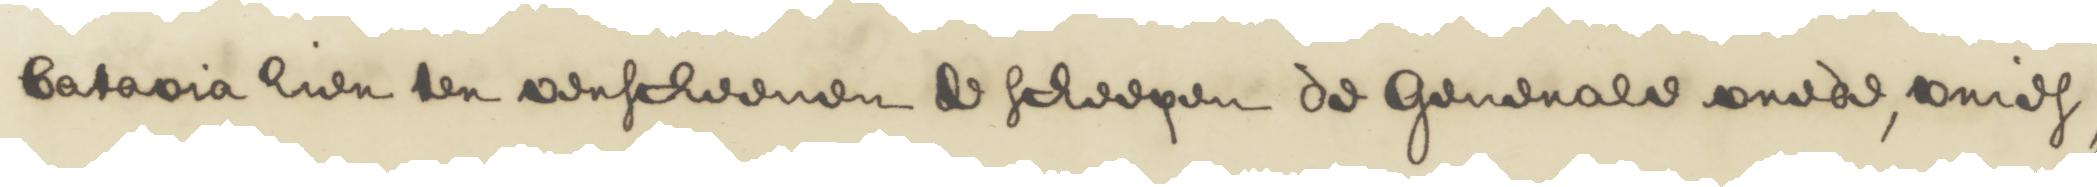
batavia hier ter verscheenen de scheepen de generale vrede, vries„
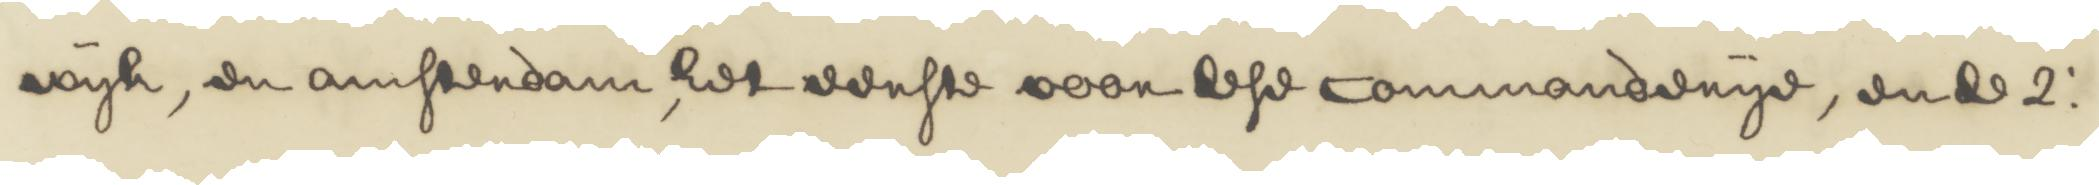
wijk, en amsterdam, het eerste voor dese commanderije, en de 2:
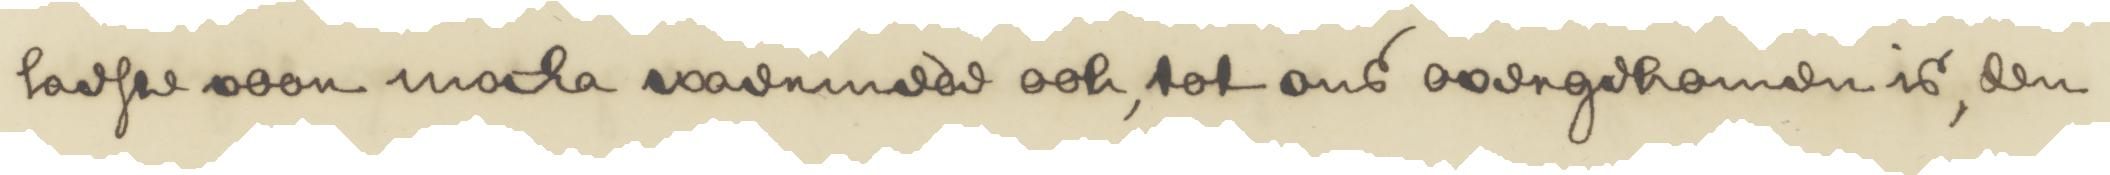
laeste voor mocha waermede ook, tot ons overgekomen is, den
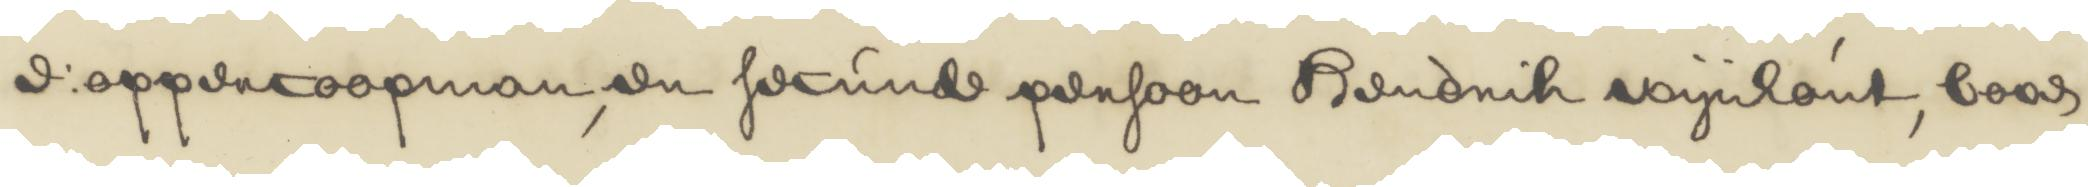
e: oppercoopman, en secunde persoon Hendrik wijnhout, boven
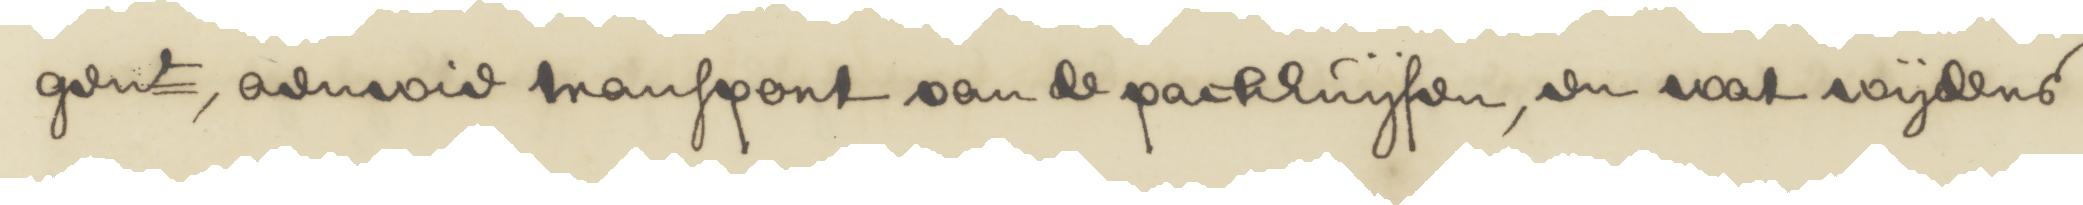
gen=t, aenwie transport van de packhuijsen, en wat wijders
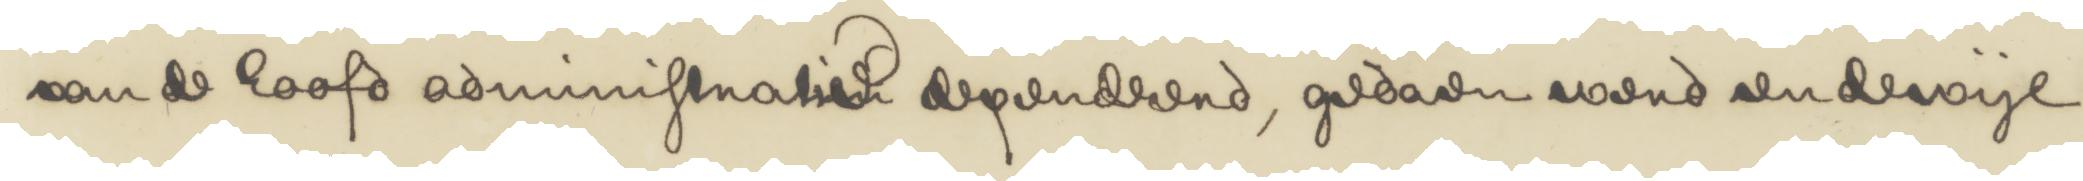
van de hoofd administratien dependeerd, gedaen werd en dewijl
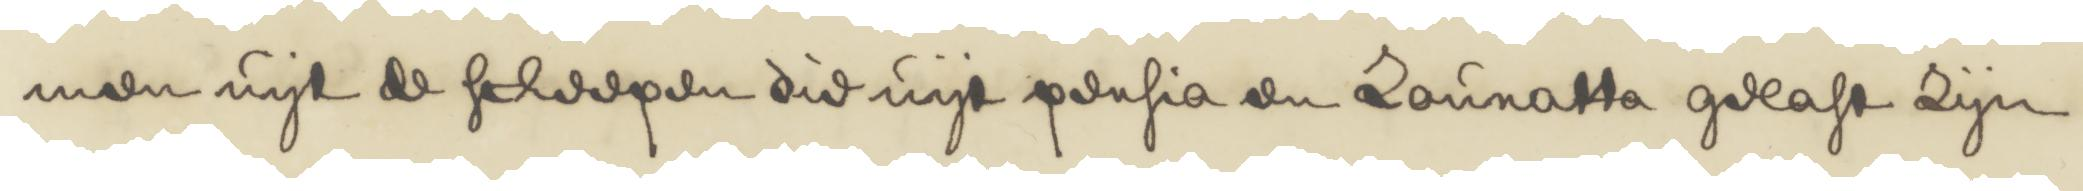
men uijt de scheepen die uijt persia en zouratta gelast zijn
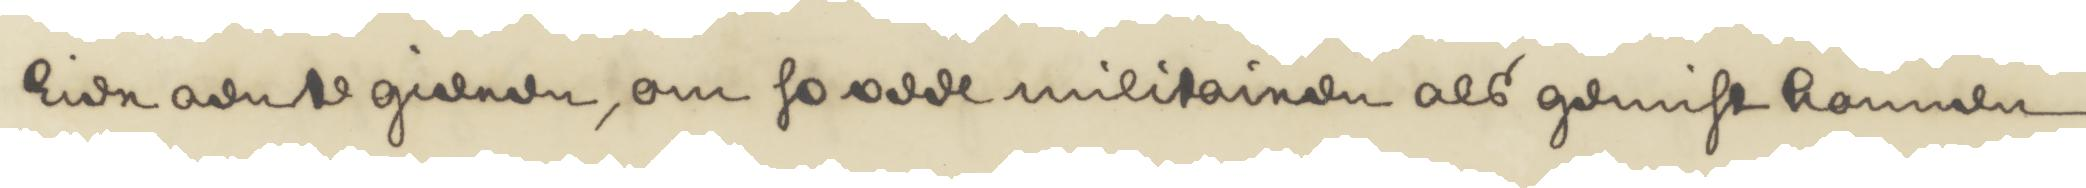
hier aen te gieren, om so veel militairen als gemist konnen
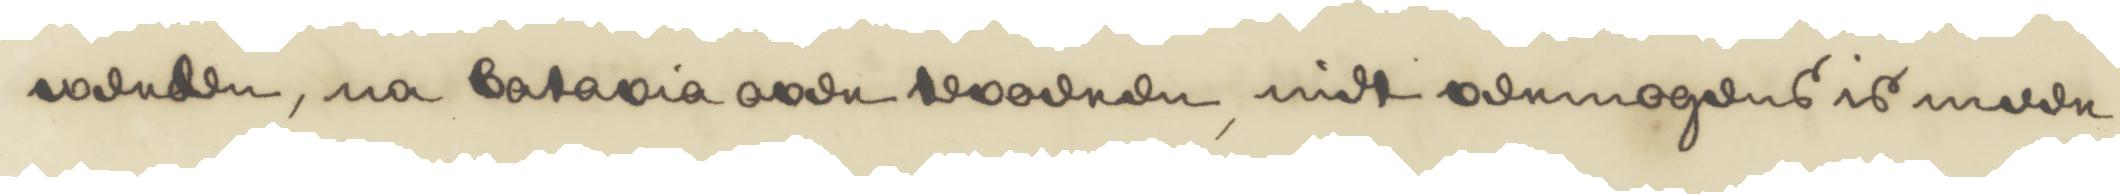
werden, na batavia over tevoeren, niet vermogens is meer
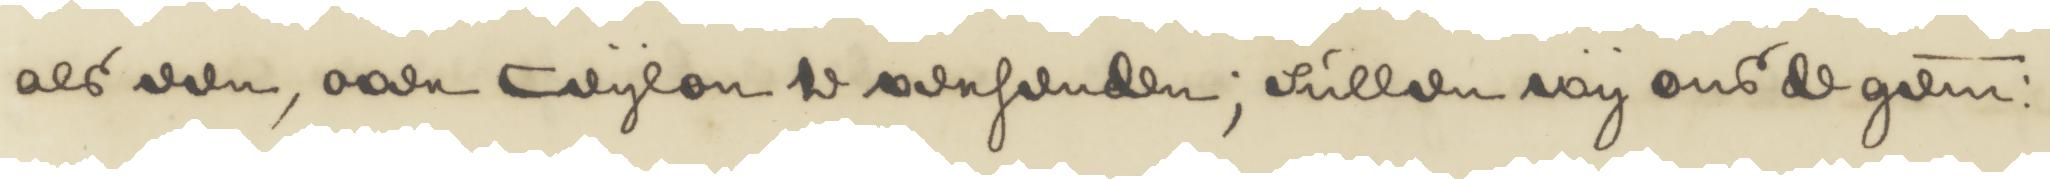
als een, over Ceijlon te versenden; sullen wij ons de gem:
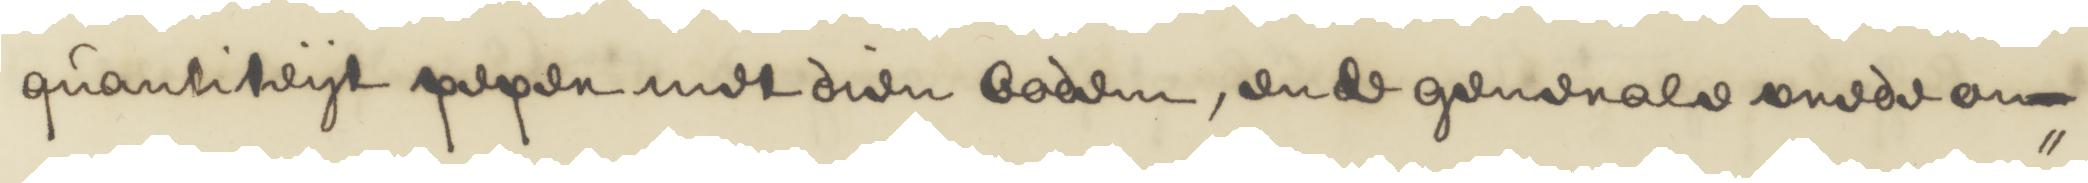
quantiteijt peper met dien bodem, en de generale vrede on„
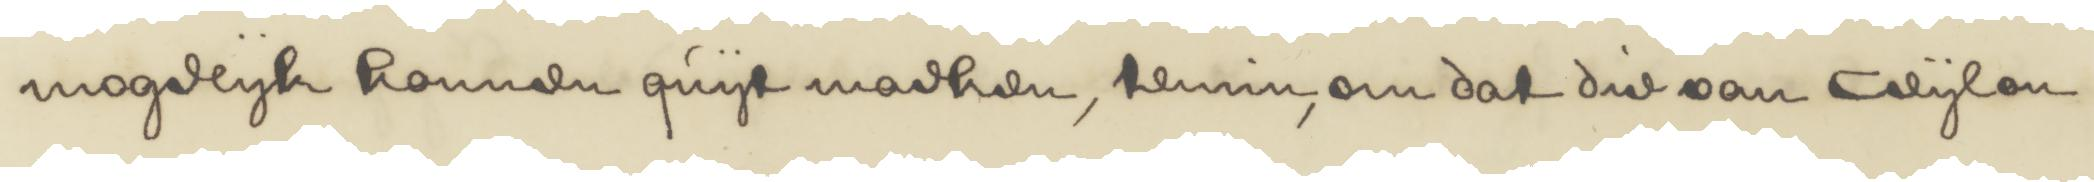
mogelijk konnen quijt maeken, temin, om dat die van Ceijlon
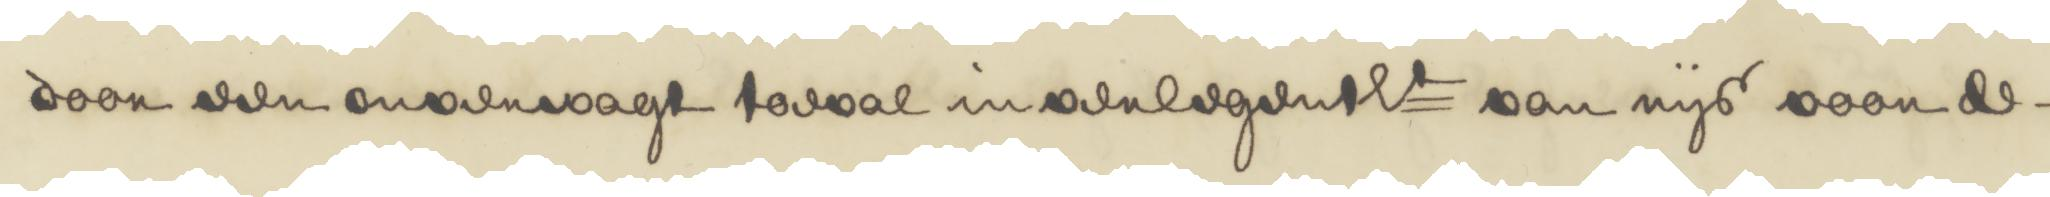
door een onverwagt toeval in verlegenth=t van rijs voor de
